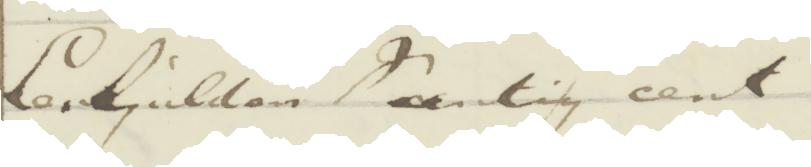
EenGulden Veertig cent
